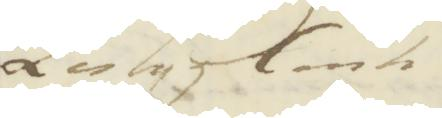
Zestig Cent
